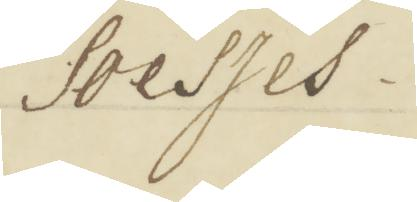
Soesjes -
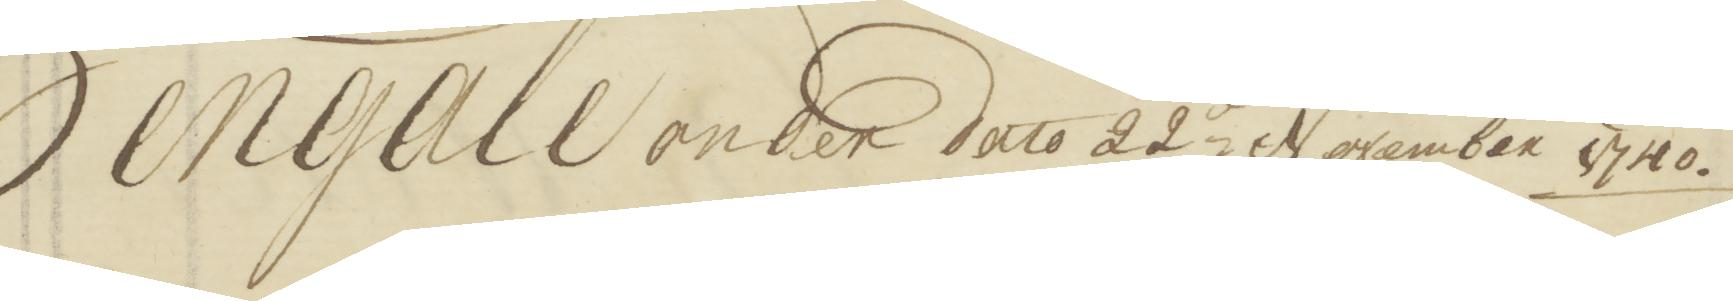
Van Bengale onder dato 22=e November 1740.
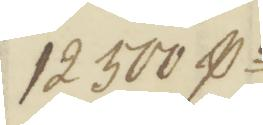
12500 p=s
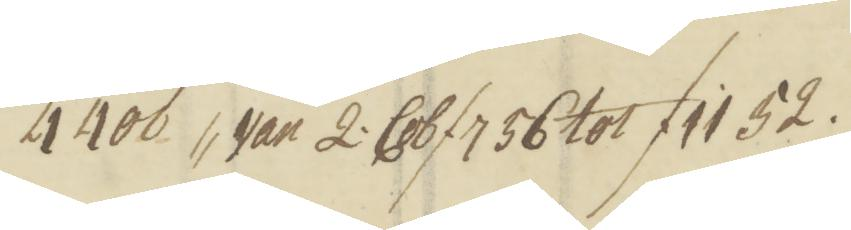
4400 „ van 2. Cob ƒ756 tot ƒ1152.
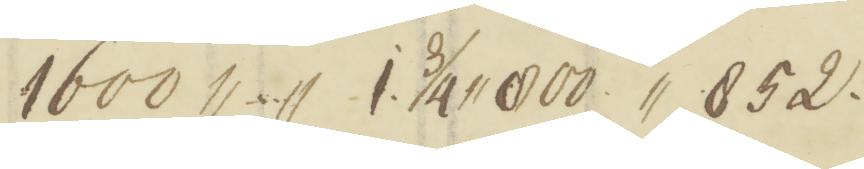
1600 „ - „ - 1.¾„800. „ 852.
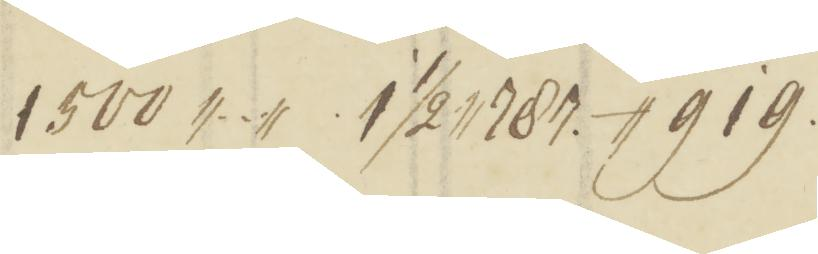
1500 „ - - - „ . 1½.„787. „ 919.
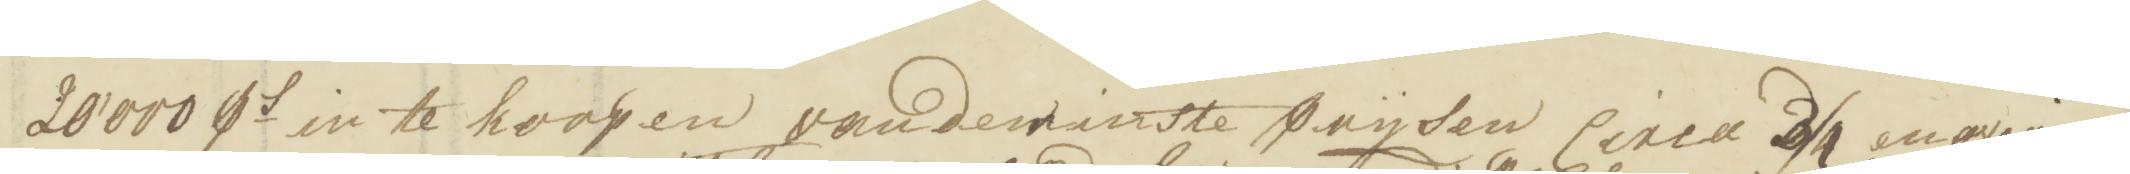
20'000 p-s in te koopen van deminste prijsen Circa ¾ en overige
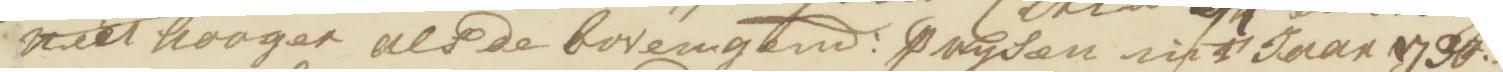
niet hooger als de bovengem: prijsen in t' Iaar 1730.
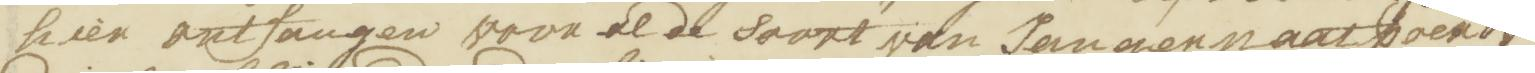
hier ontfangen voor al de soort van Iangernaat poer of
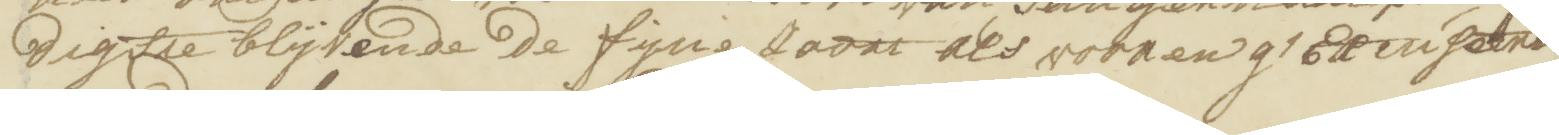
digste blijvende de fijne zoort als vooren g’Excuseert
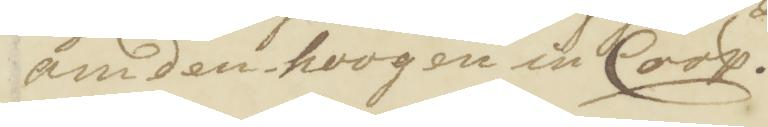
om den - hoogen in Coop.
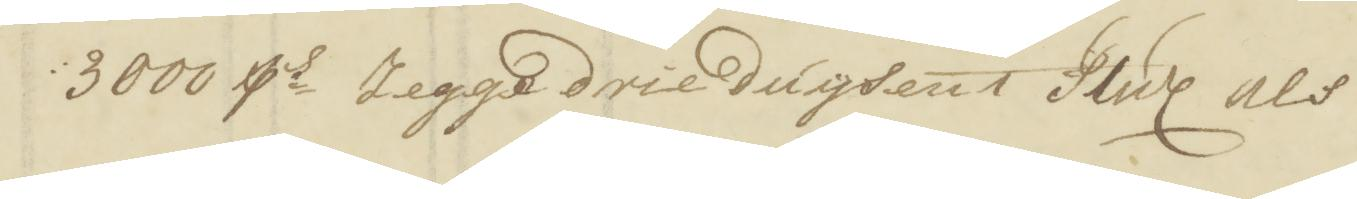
3000 p=s zegge drie duijsent stux als
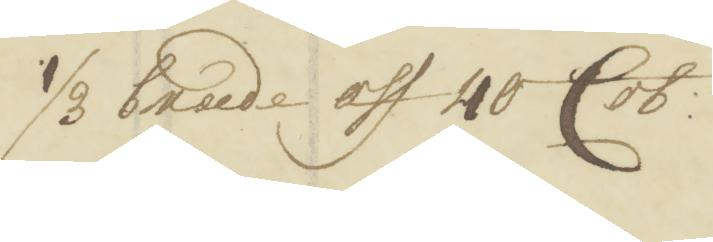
1/3 breede off 40 cob:
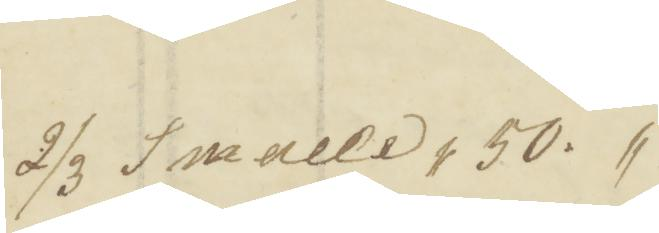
2/3 smalle „ 50. „
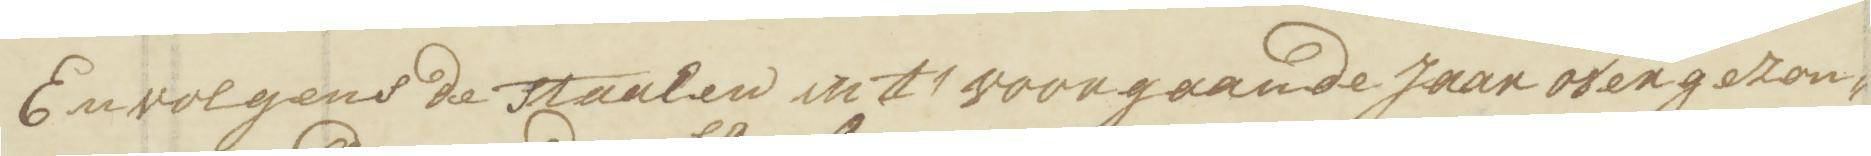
En volgens de staalen in t' voorgaande Jaar overgezon„
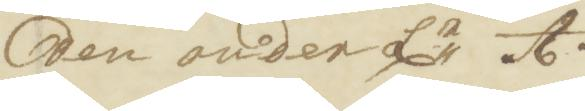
den onder L„r A.
